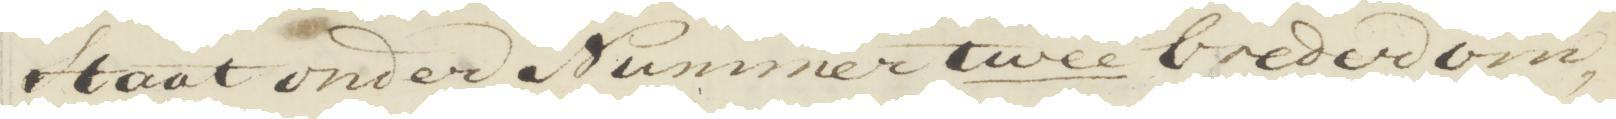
staat onder Nummer twee breder om„
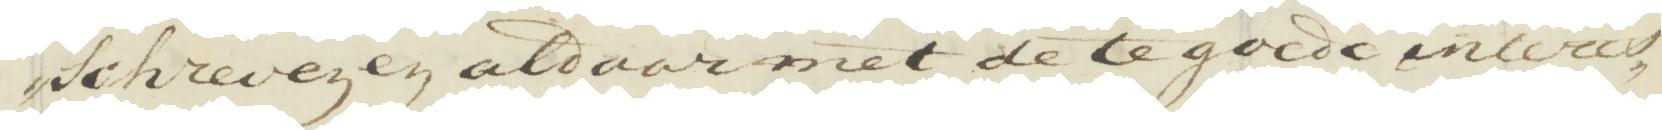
„schreven en aldaar met de te goede interes„
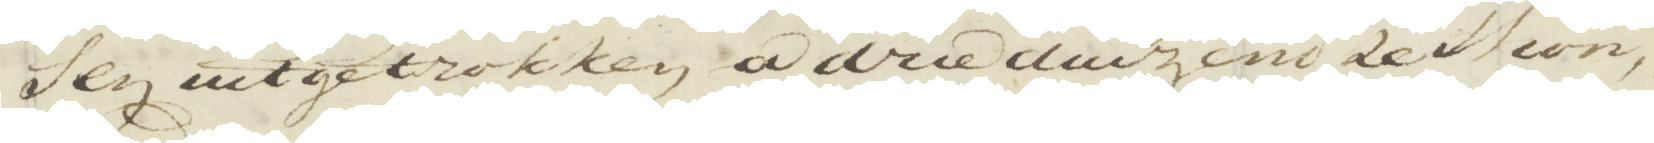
sen uitgetrokken a drie duizend zeshon,
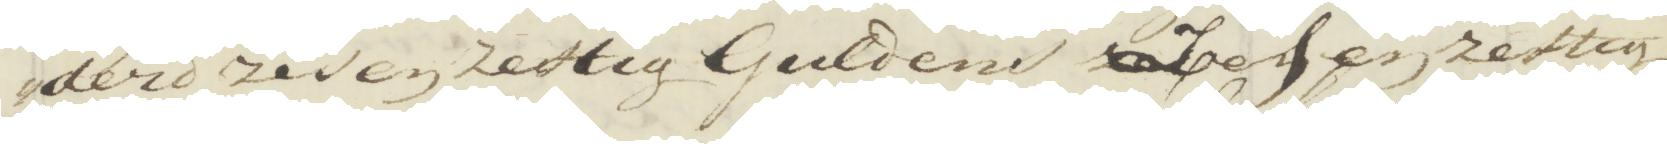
derd zes en zestig Guldens Zes en zestig
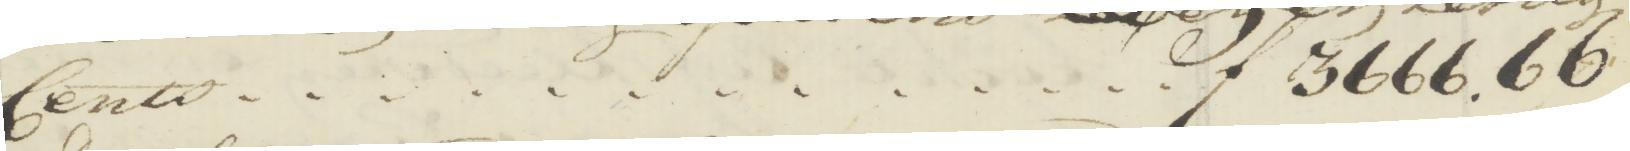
Cents . . . . . . . . . . . . . ƒ 3666. 66
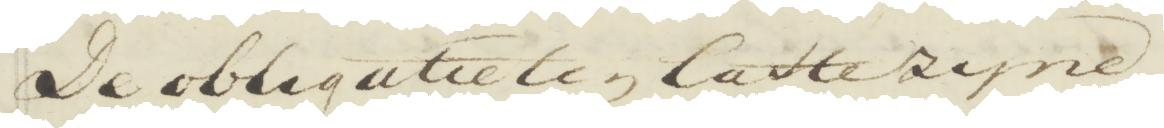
De obligatie ten laste zyne
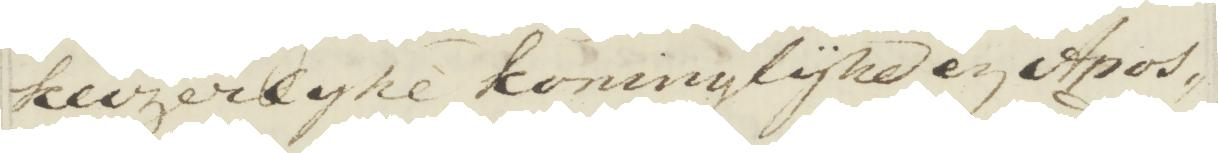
keizerlyke koninglijke en Apos„
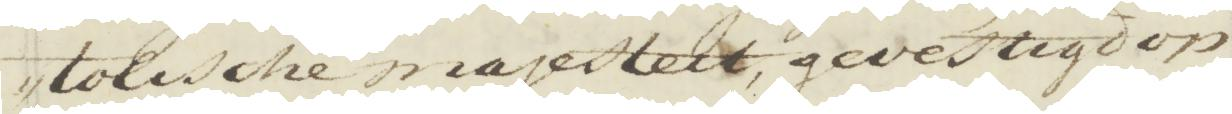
„tolische majesteit, gevestigd op
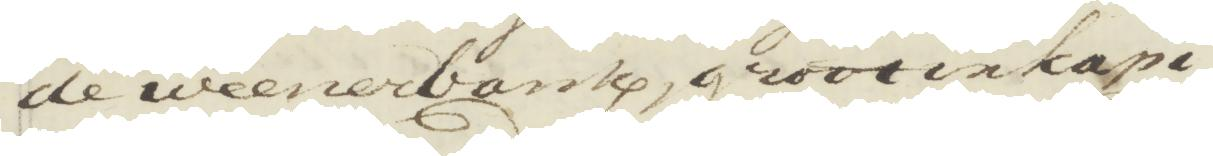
de weenerbank, groot in kapi,
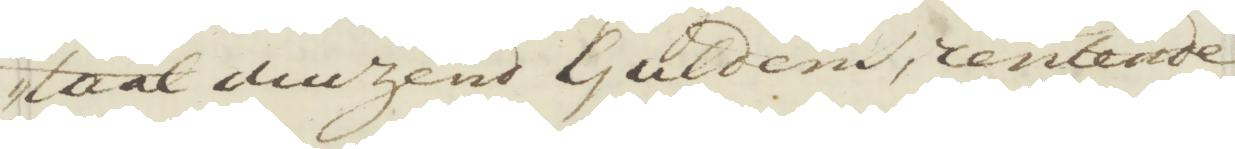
„taal duizend Guldens, rentende
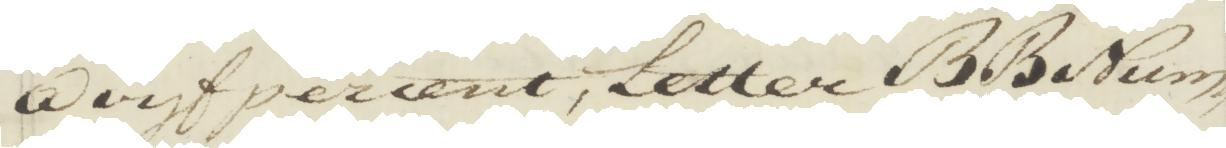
à vyf percent, letter BB Num
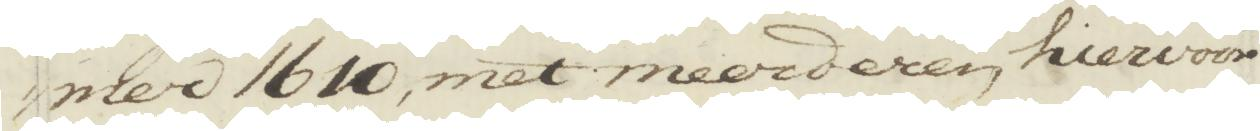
„mer 1610, met meerderen hiervoor
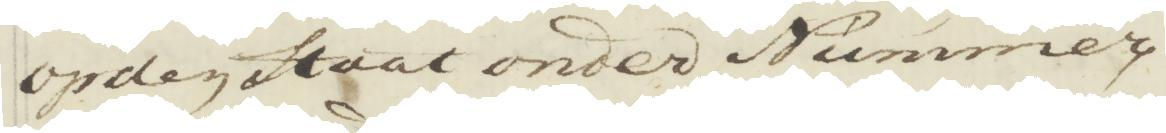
op den staat onder Nummer
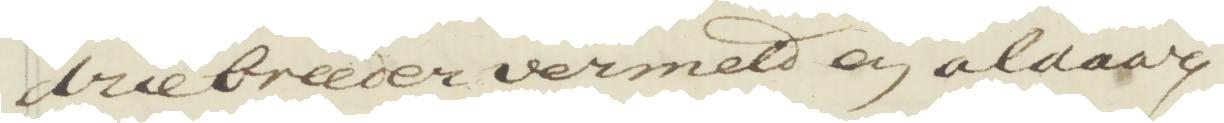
drie breeder vermeld en aldaar
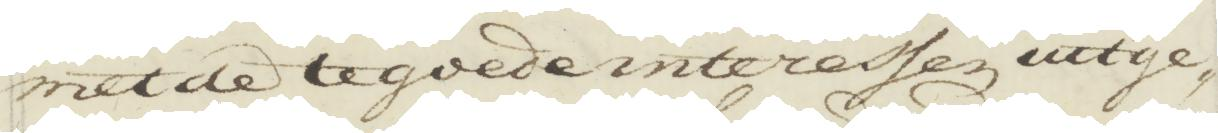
met de te goede interessen uitge
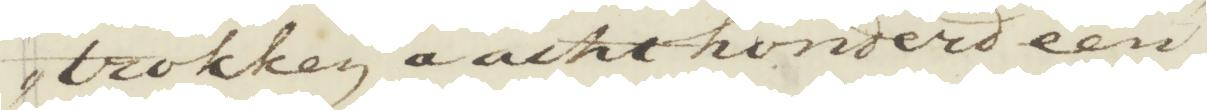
„trokken a acht honderd een
